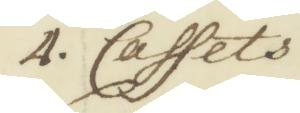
4. Cassets
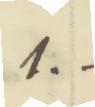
1.— —
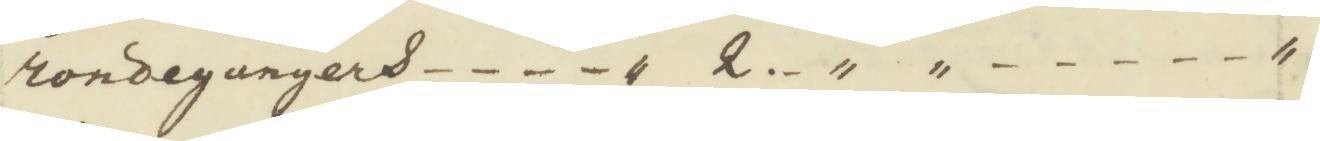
rondegangers - - - - „ 2.- „ „ - - - - - „
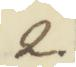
2.— —
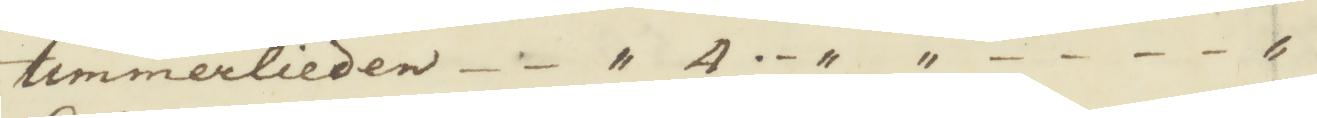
timmerlieden - - „ 4. - „ „ - - - - „
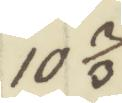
— 10 2/3
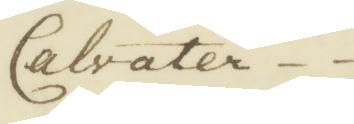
Calvater - -
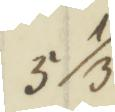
5 1/3
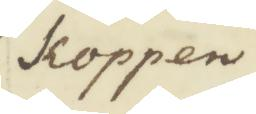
koppen
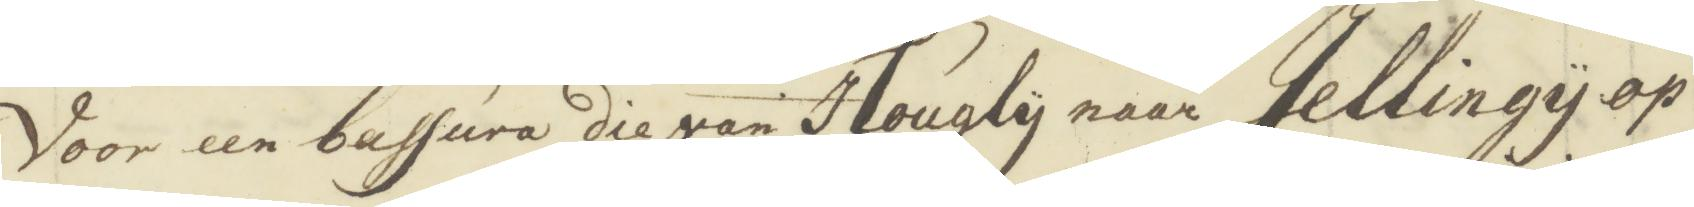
Voor een bassura die van Houglij naar Jellingij op
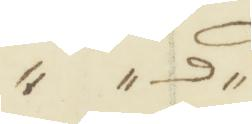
„ „ D„
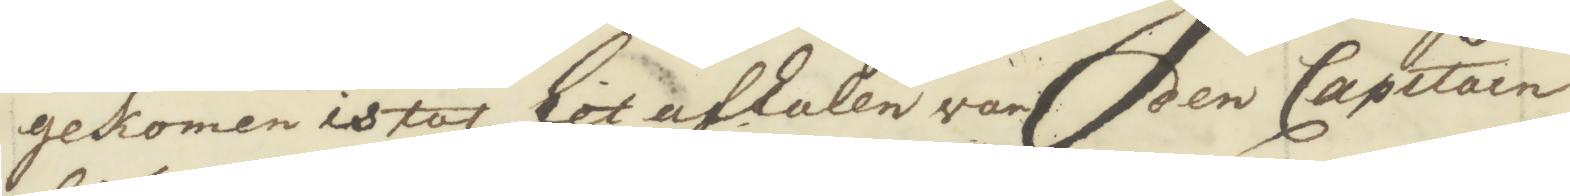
gekomen is tot het afhalen van den Capitain
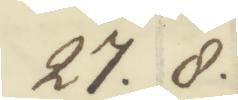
27. 8.
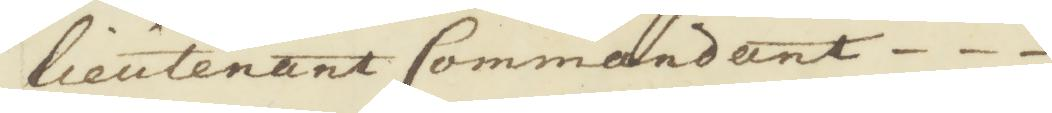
lieutenant Commandant - - -
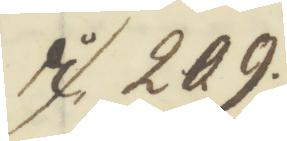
r:o/, 209.
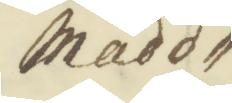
Madd„s
